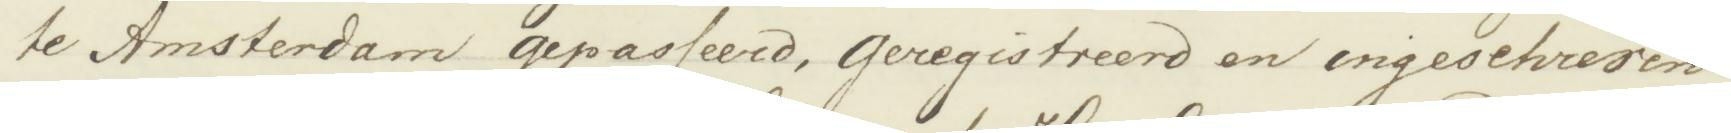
te Amsterdam gepasseerd, geregistreerd en ingeschreven
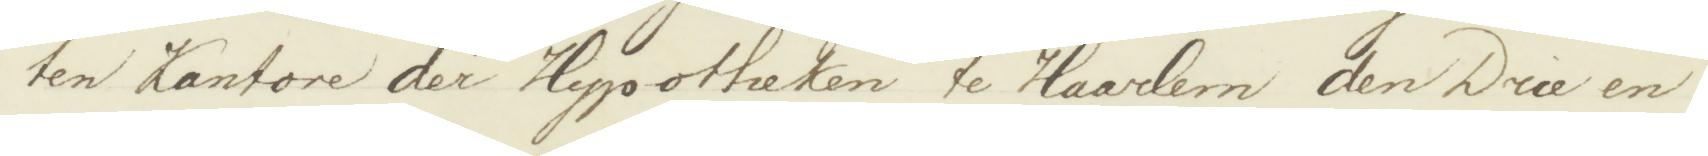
ten Kantore der Hypotheken te Haarlem den Drie en
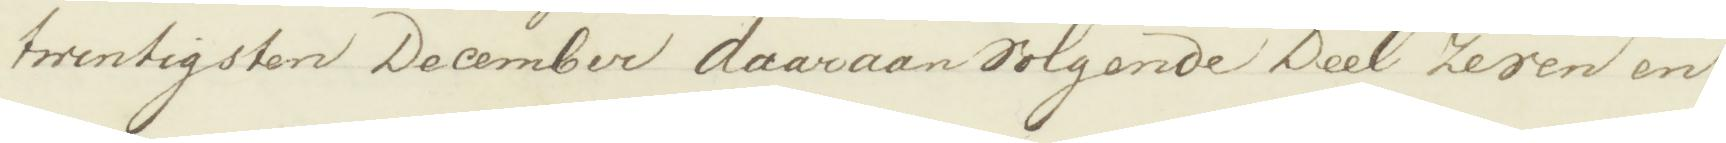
twintigsten December daaraanvolgende Deel zeven en
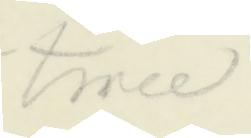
¶ twee
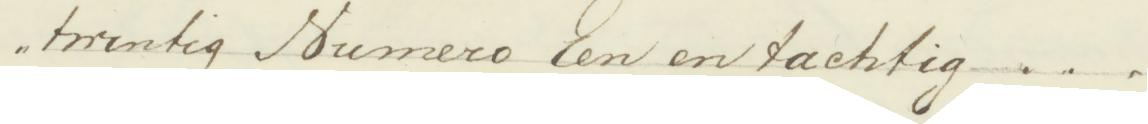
„twintig Numero Een en tachtig . . .
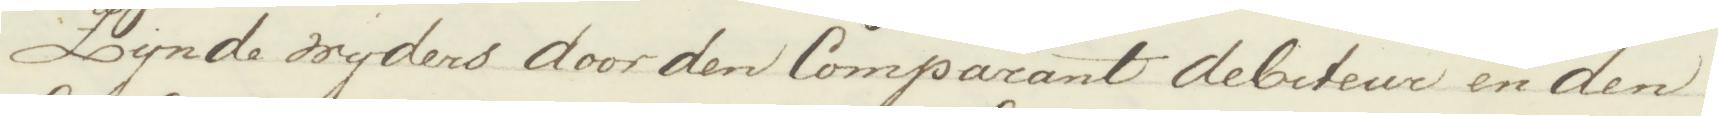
Zijnde wyders door den Comparant debiteur en den
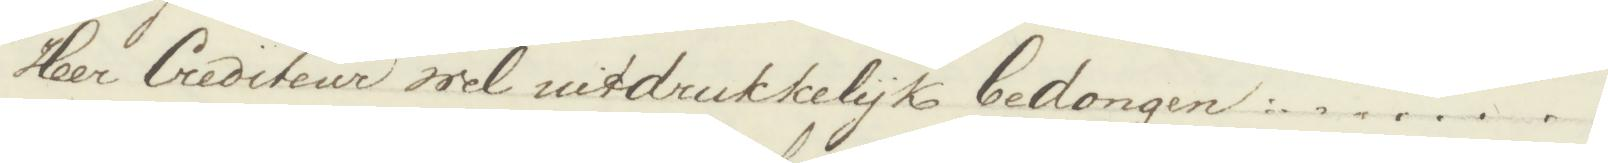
Heer Crediteur wel uitdrukkelijk bedongen: . . . . . . .
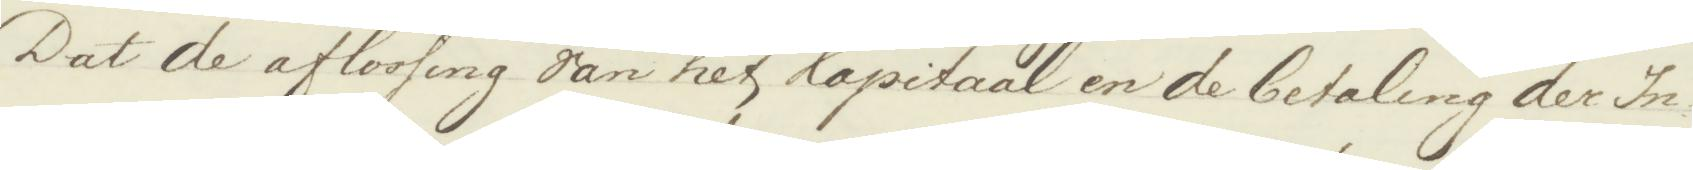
Dat de aflossing van het kapitaal en de betaling der In
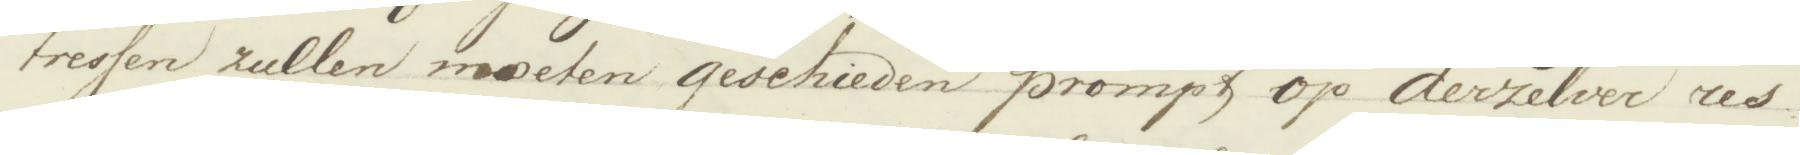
tressen zullen moeten geschieden prompt op derzelver res
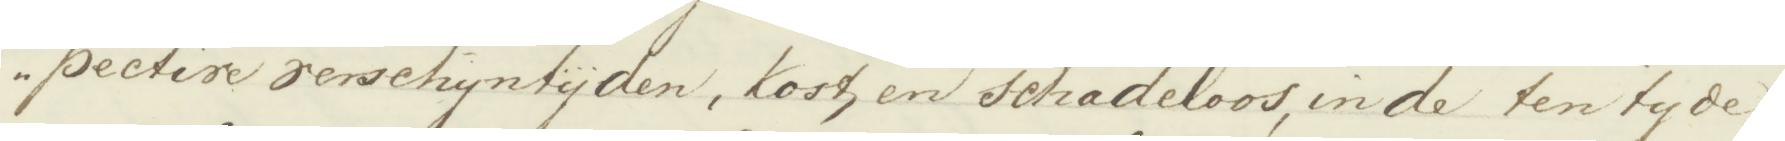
„pective verschijntijden, kost en schadeloos, in de ten tyde
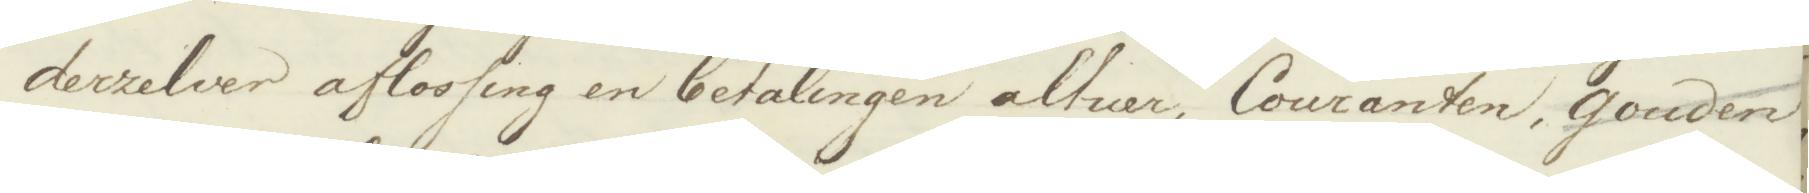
derzelver aflossing en betalingen alhier, Couranten, Gouden
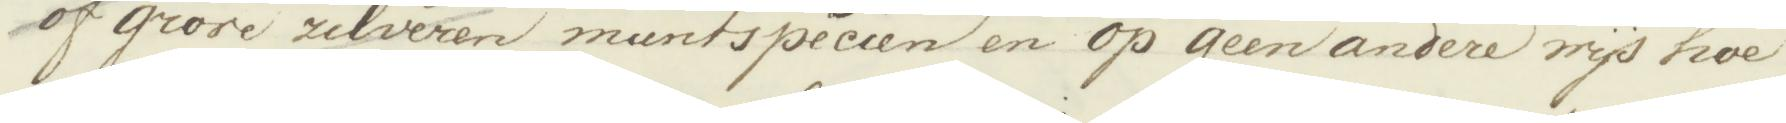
of grove zilveren muntspeciën en op geen andere wijs hoe
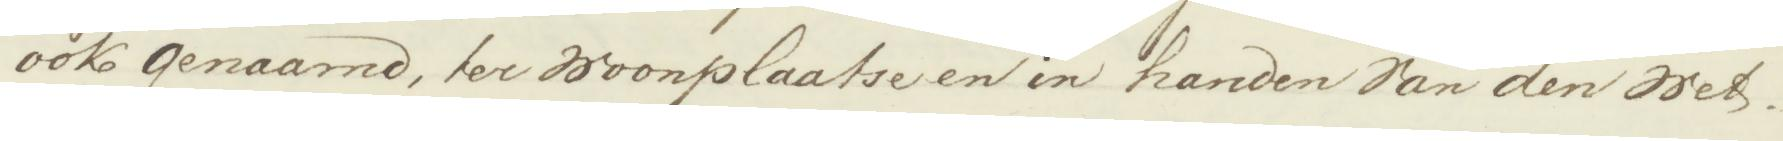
ook genaamd, ter woonplaatse en in handen van den wet
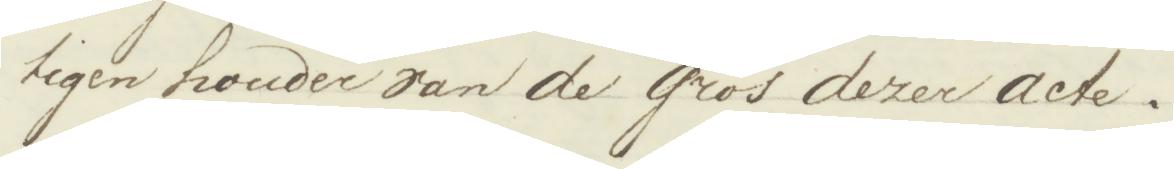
tigen houder van de Gros dezer acte.
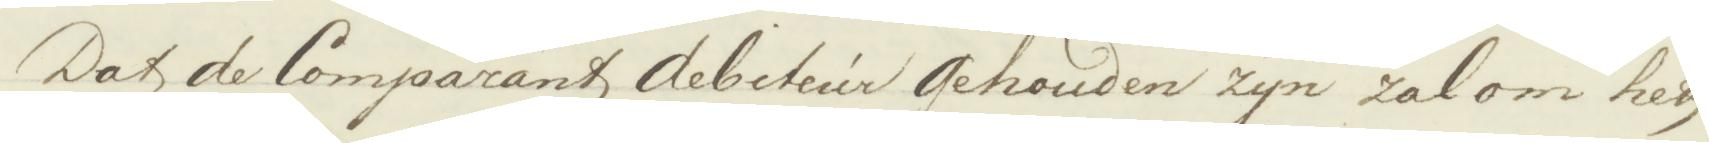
Dat de Comparant debiteur gehouden zijn zal om het
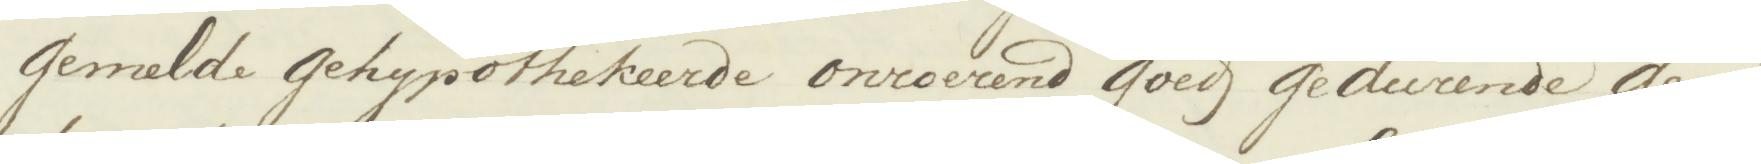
gemelde gehypothekeerde onroerend goed gedurende den
